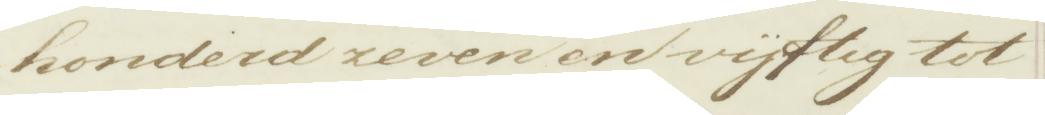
honderd zeven en vijftig tot
